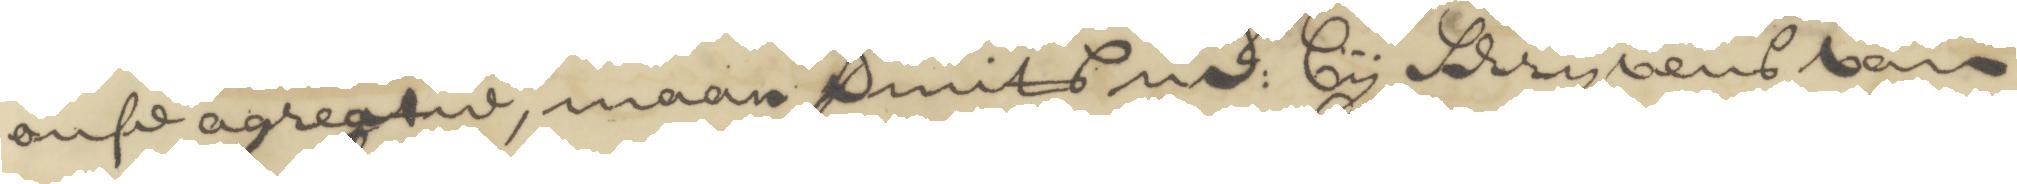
onse agreatie, maar vermits uE: bij schrijvens van
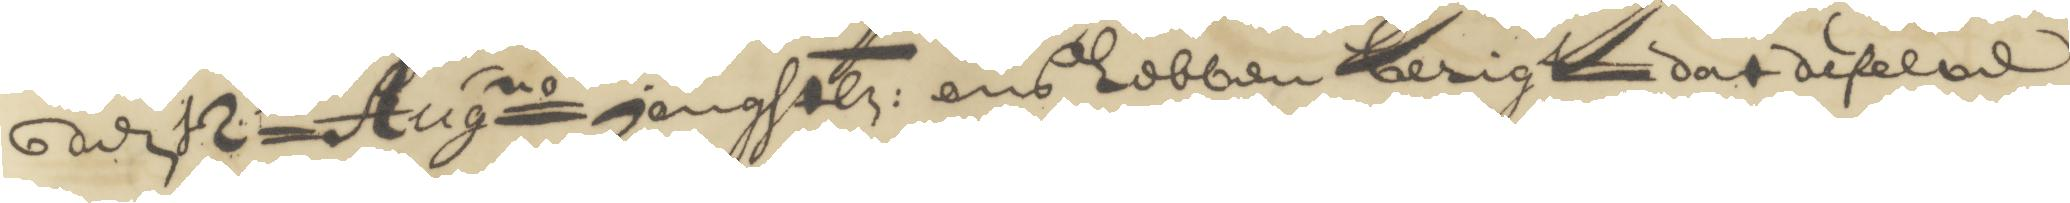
den 12=en Aug=to jongstl: ons hebben berigt dat deselve
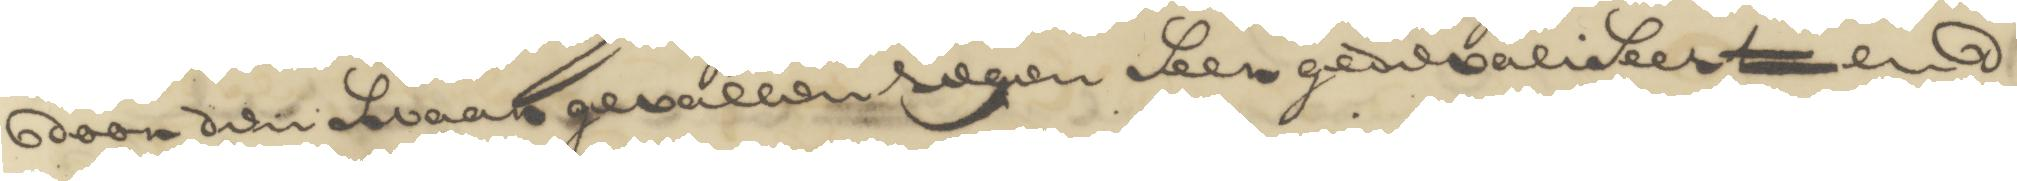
door den swaar gevallen regen seer gedevaliseert en d
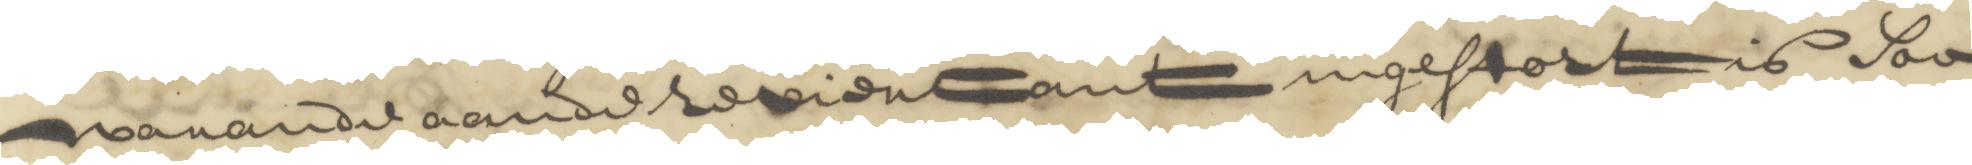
warande aande reviercant ingestort is soe
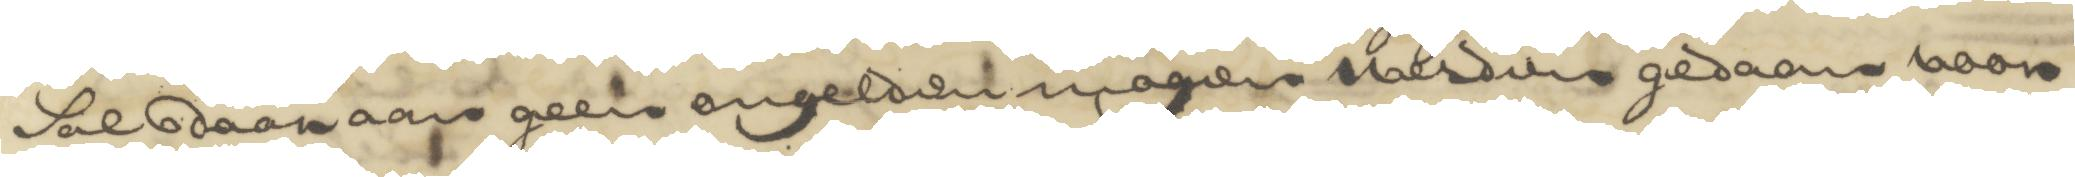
sal daar aan geen ongelden mogen werden gedaan voor
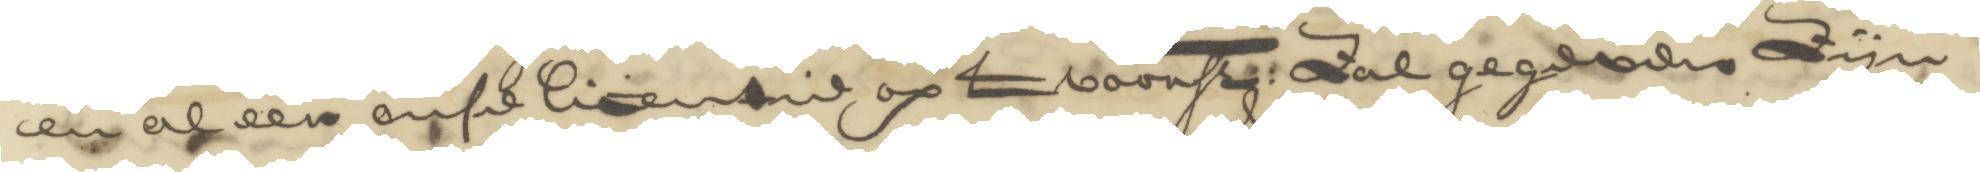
en al eer onse licentie op ’t voorsz: zal gegeven zijn
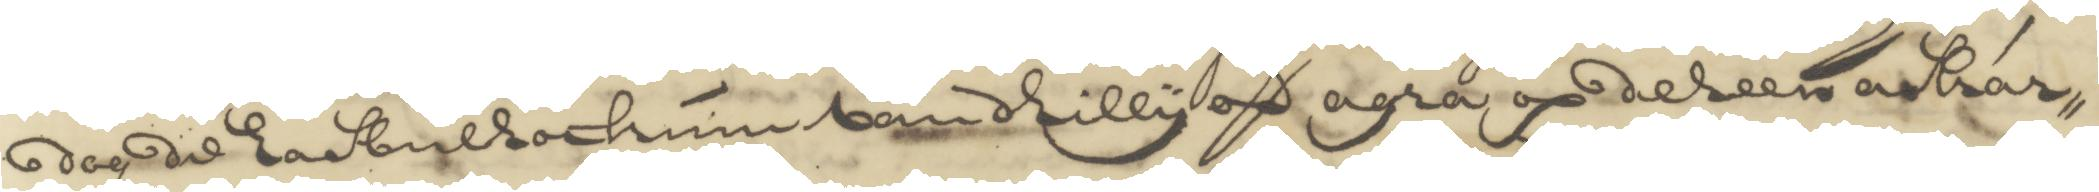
dog de hasbulhockum van dhillij over agra op de heer askar„
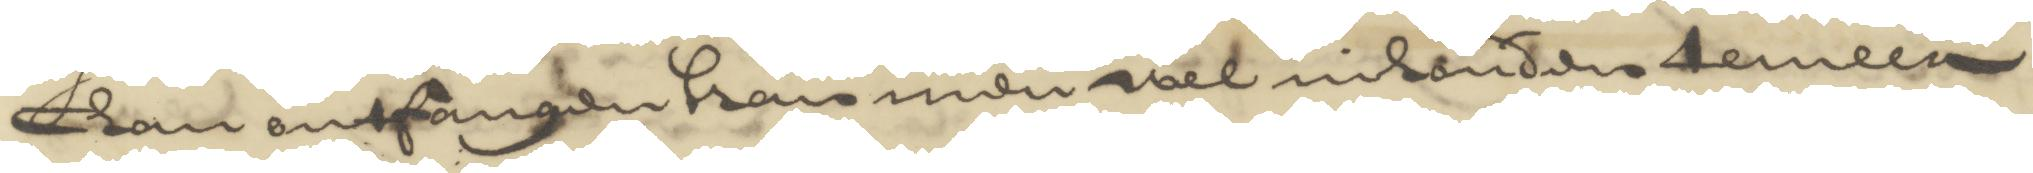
chan ontfangen kan men wel inhouden temeer
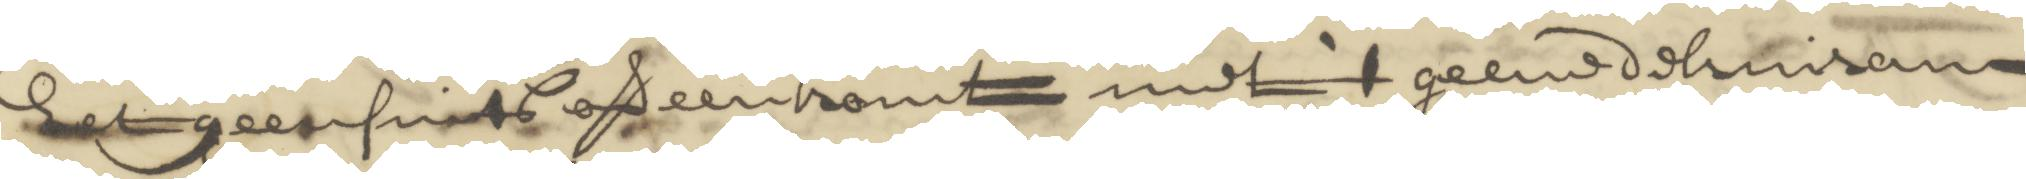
het geensints over eenkomt met 't geene de kniran
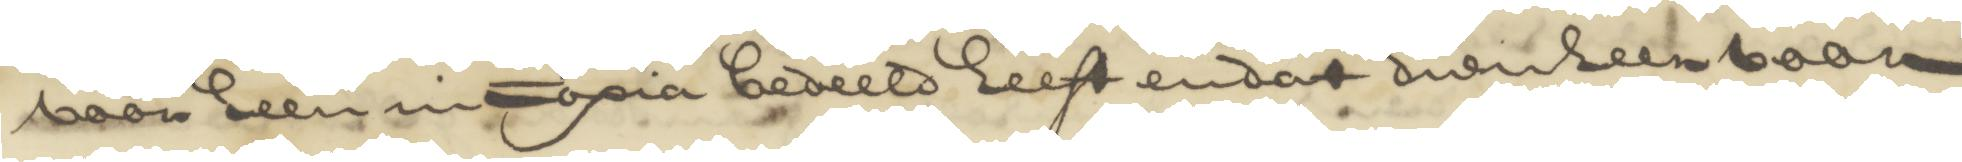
voor heen in copia bedeeld heeft en dat dien heer voor
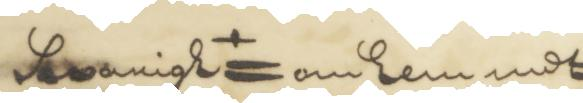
swarigh=t om hem met
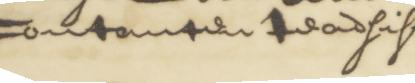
contanten teadsisteren.
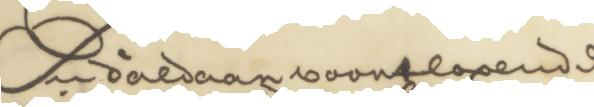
Soo d'aldaar voortlopende
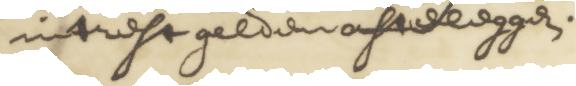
intrest gelden afteleggen
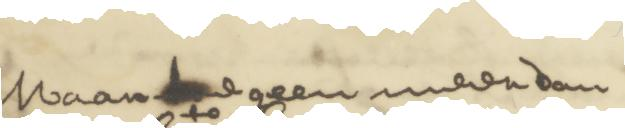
waar toe geen meer dan
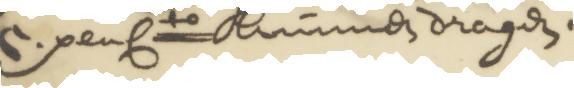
5. perC=to kunnen dragen
